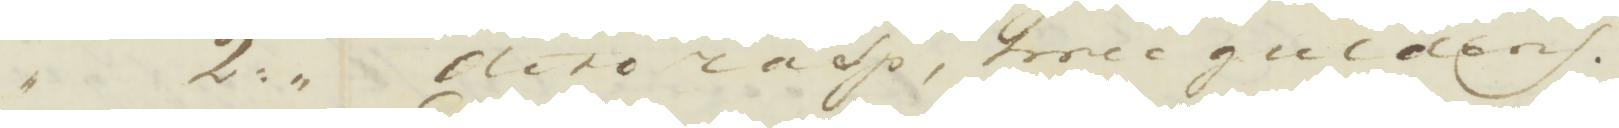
„ 2: „ dito rasp, twee guldens.
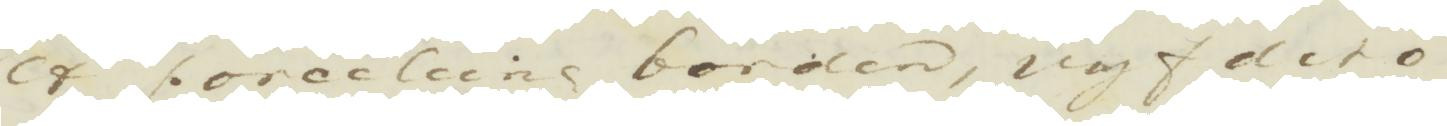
Een porceleine borden, vyf dito
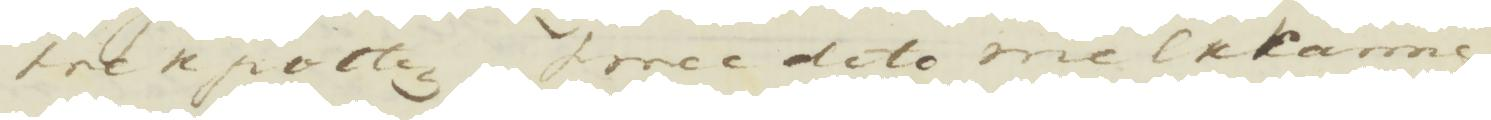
trekpotten, twee dito melkkannen
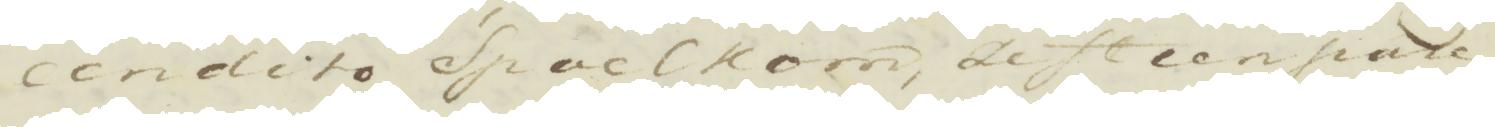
een dito spoelkom, zestien paren
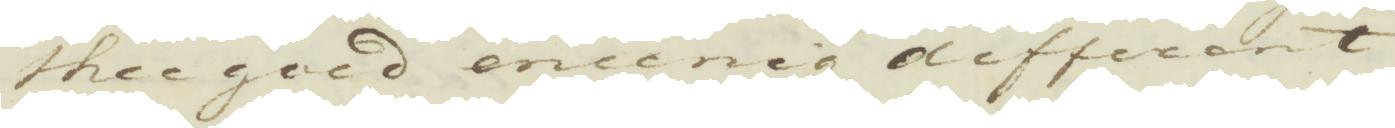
theegoed en eenig different
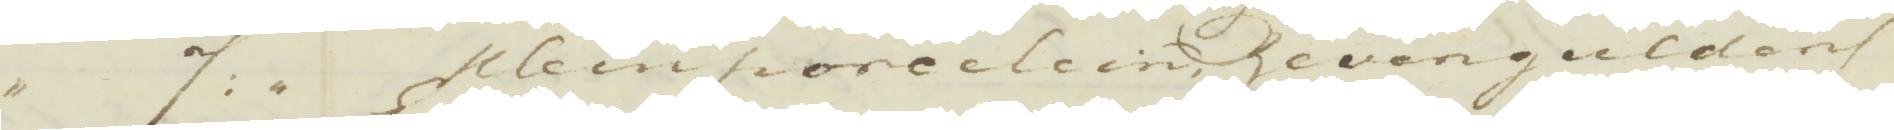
„ 7: „ klein porcelein, zeven guldens
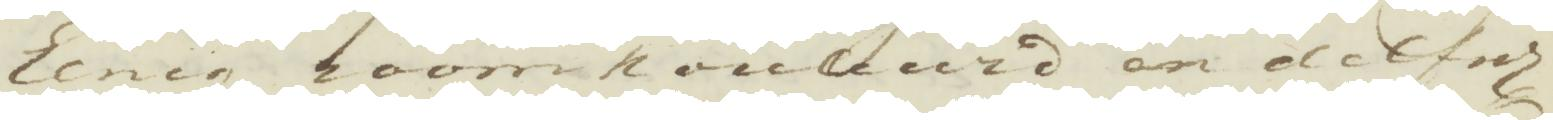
Eenig room kouleurd en delfsch
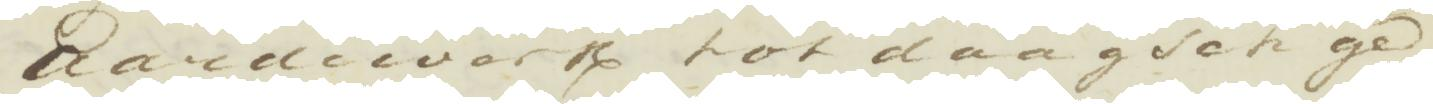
aardewerk tot daagsch ge
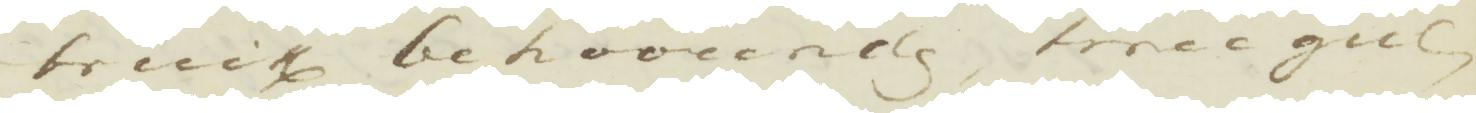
bruik behoorende, twee gul
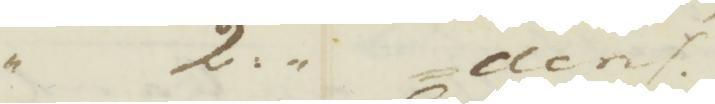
„ 2: „ =dens.
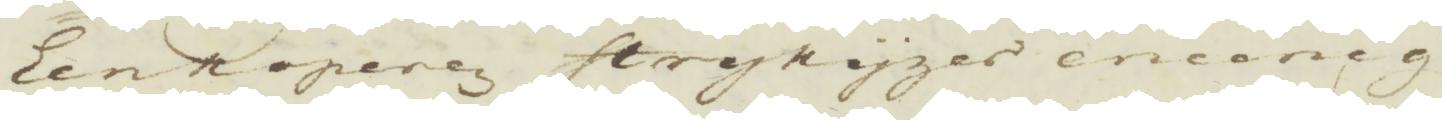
Een koperen strykijzer en eenig
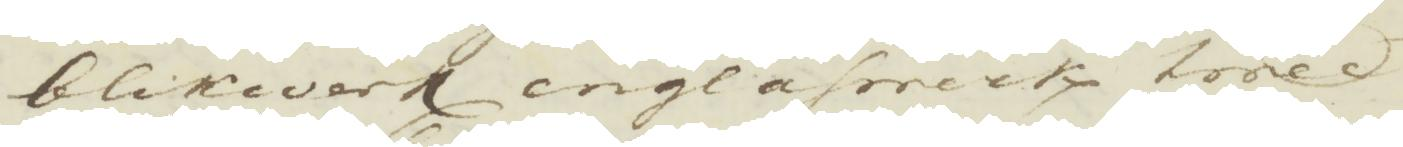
blikwerk en glaswerk twee
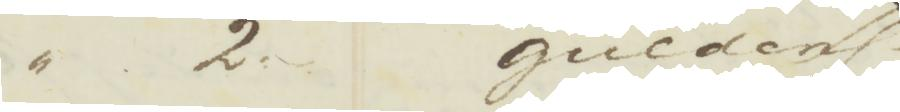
„ 2: „ guldens
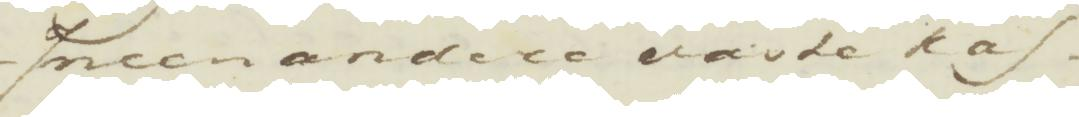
In een andere vaste kas
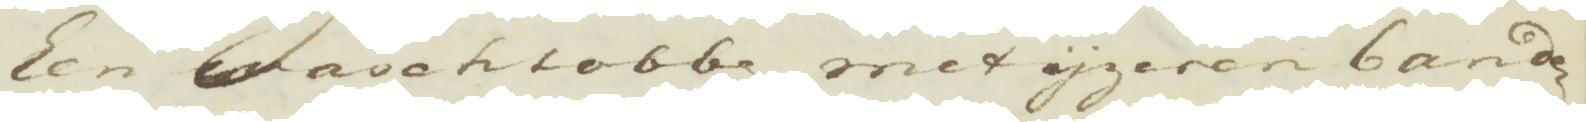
Een waschtobbe met ijzeren banden
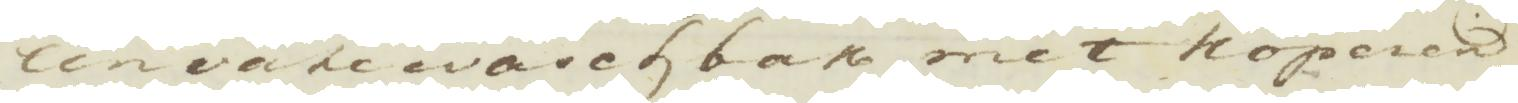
een vate waschbak met koperen
